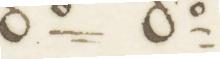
d=o d=o
